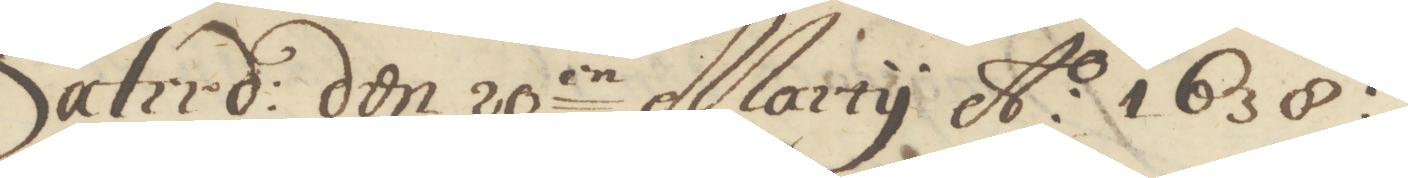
Saterd: den 20=en Martij A:o 1638:
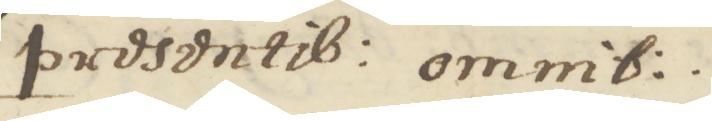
presentib: omnib:
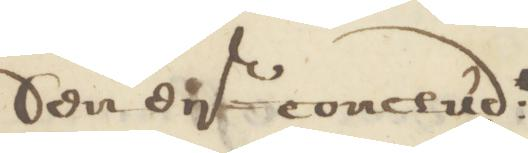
den ey=r conclud:t pro
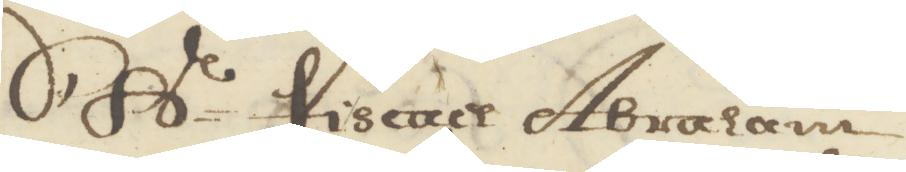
D’ H=r Fiscael Abraham
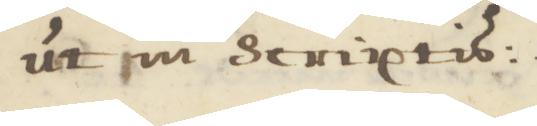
ut in scriptis:
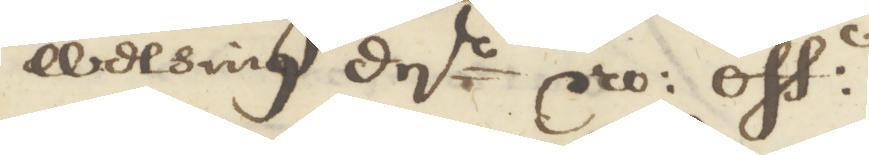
welsing ey=r no: off:
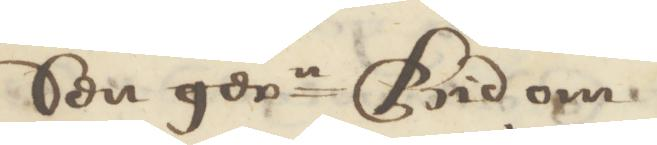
Den gev=n Bid om
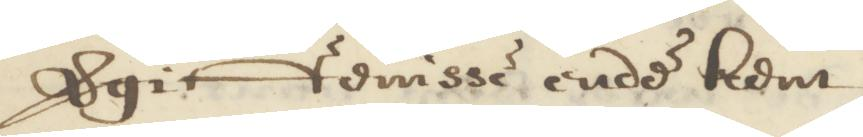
vergiffenisse ende kent
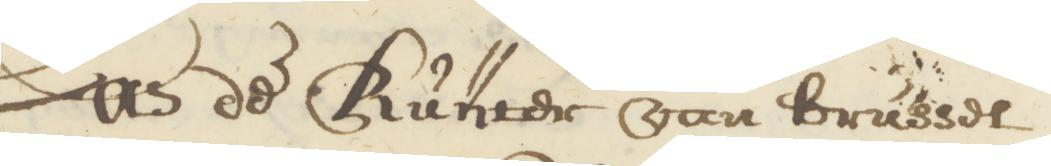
Jan de Ruijter van brussel
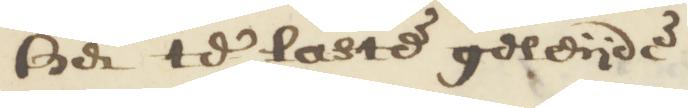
het te laste geleijde
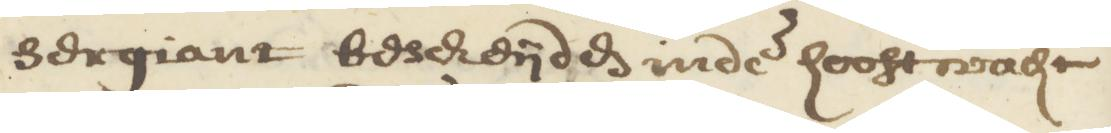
sergiant bescheijden inde hooftwacht
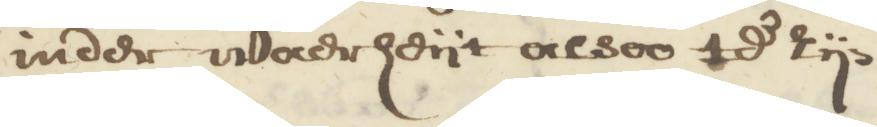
inder Waerheijt alsoo te zijn
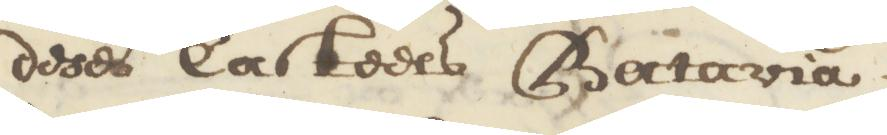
deses Casteels Batavia —
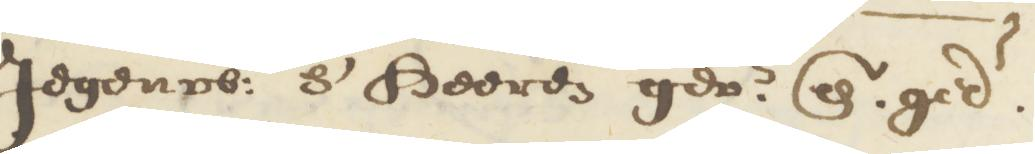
Jegenw: s Heeren gev:s ende ged.s
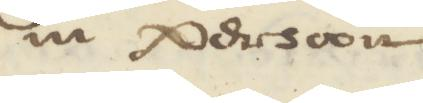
in persoon
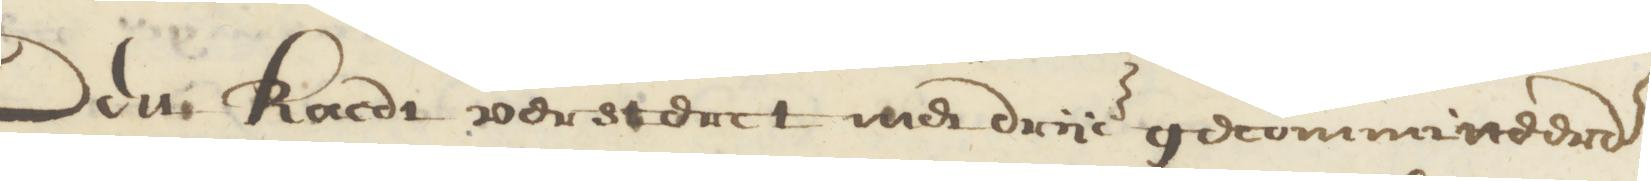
Den Raedt versterct met drije gecommitteerde
